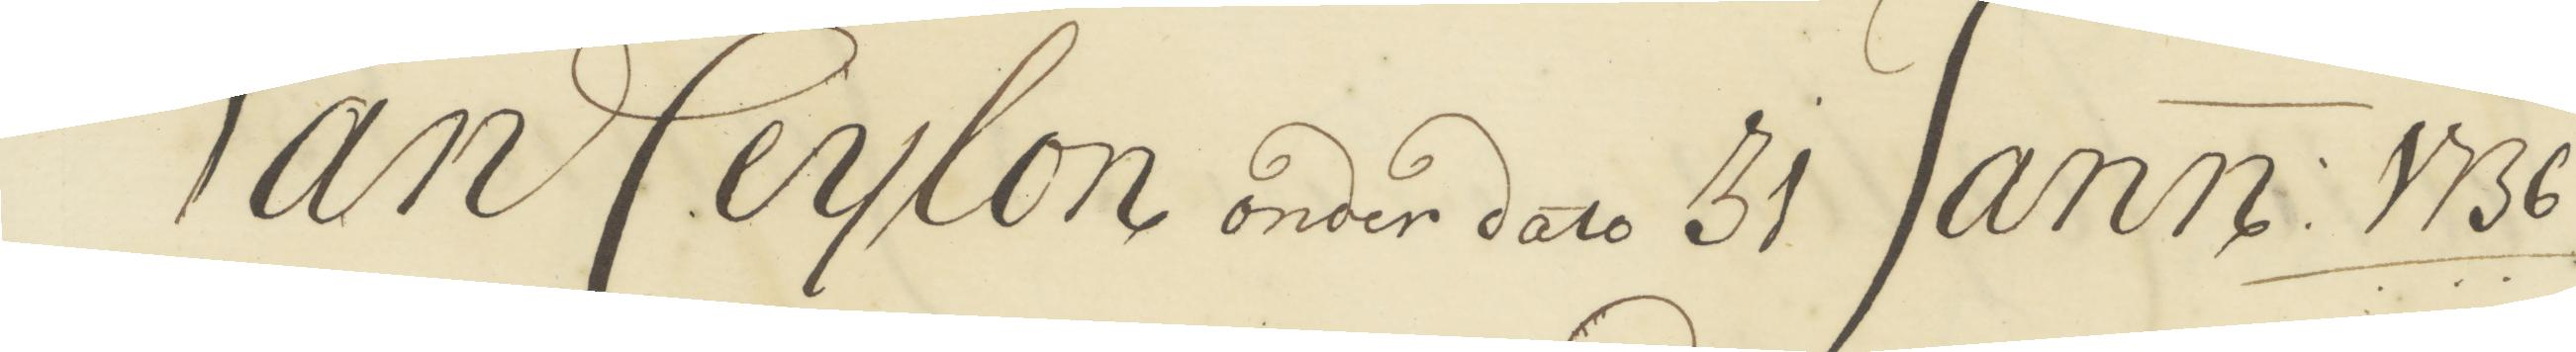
Van Ceylon onder dato 31 Jann: 1736
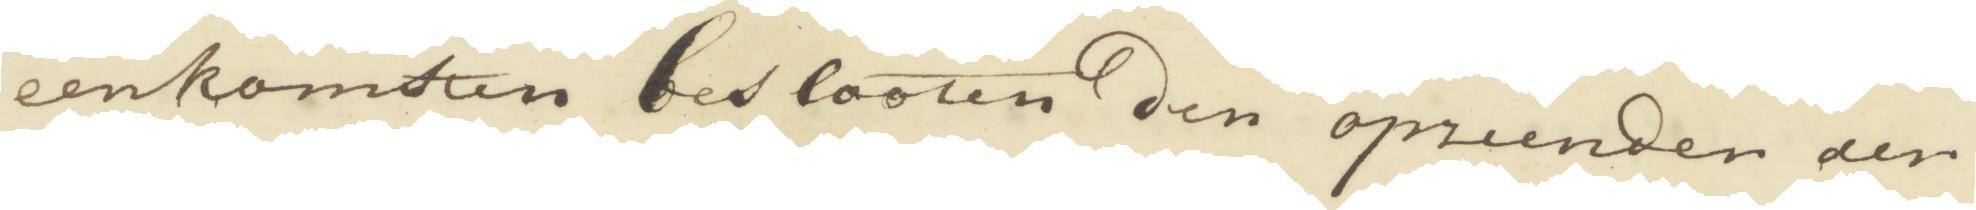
eenkomsten beslooten den opziender der
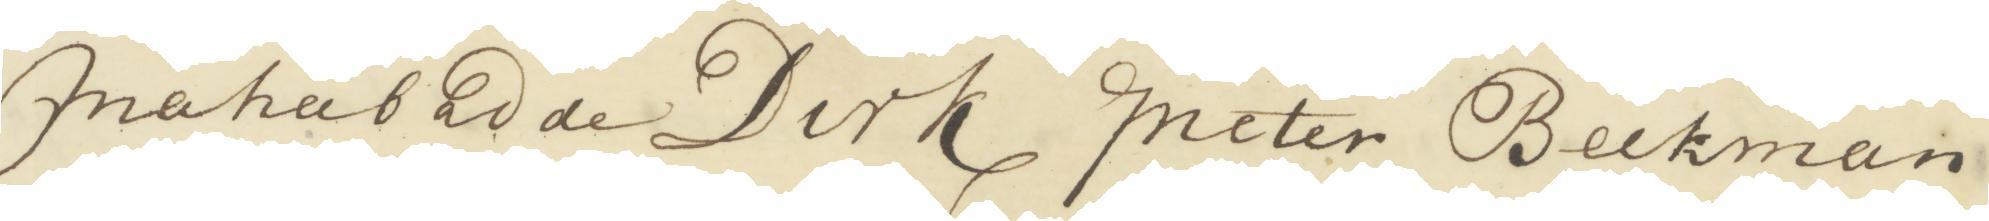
mahabadde Dirk pieter Beekman
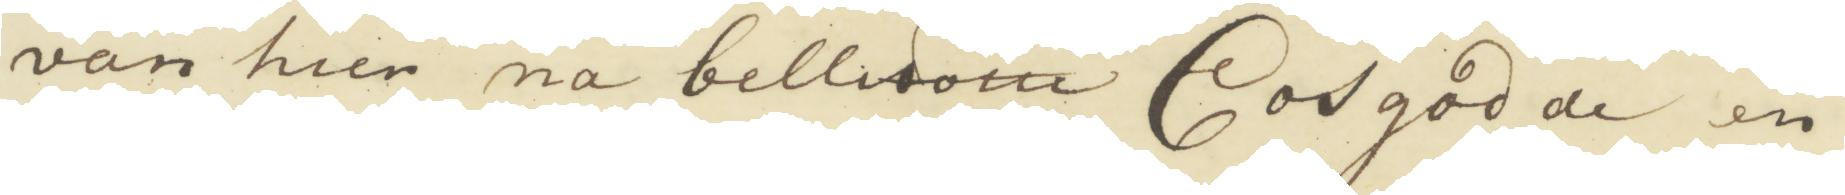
van hier na bellitotte Cosgodde en
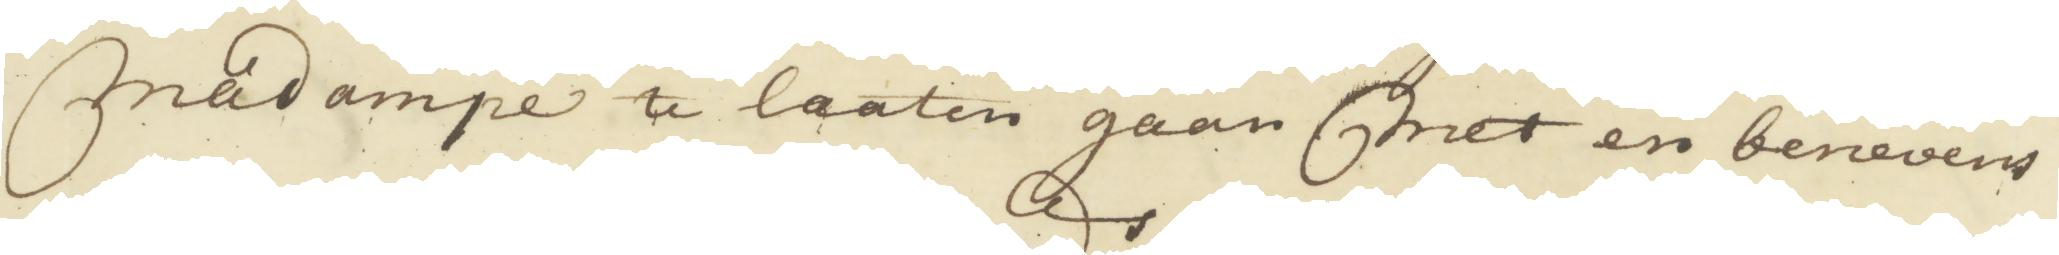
madampe te laaten gaar met en benevens
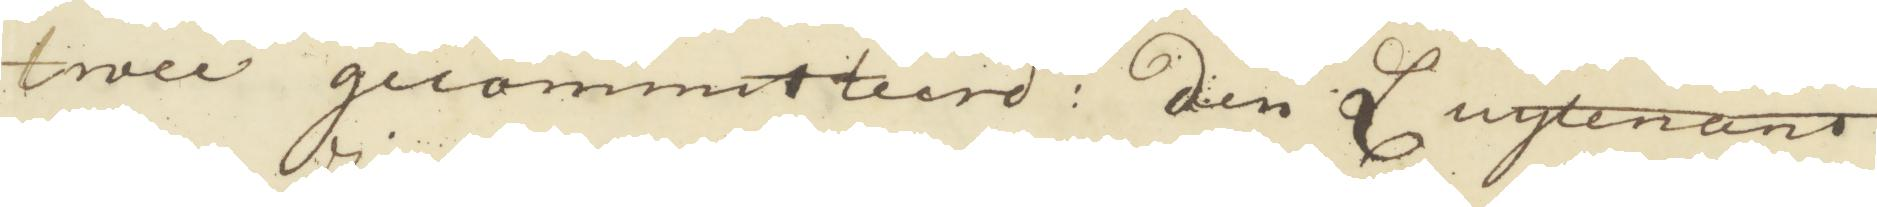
twee gecommitteerd:s den Luytenant
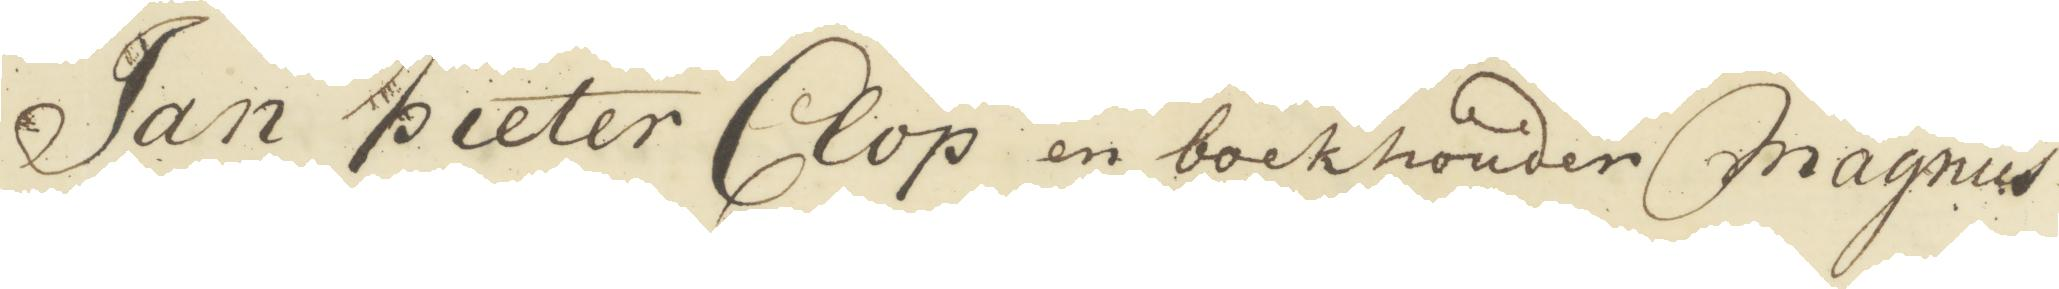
Jan Pieter Clop en boekhouder Magnus
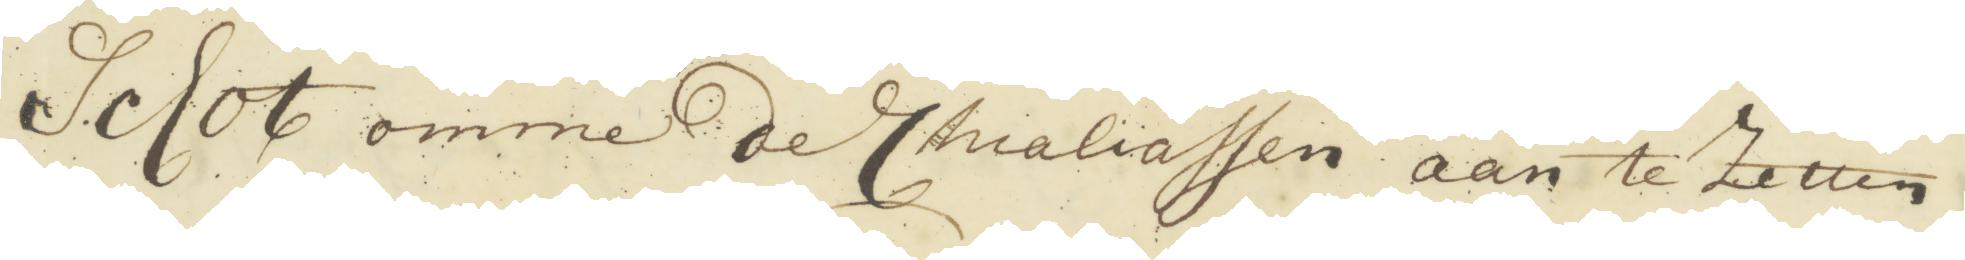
Schot omme de Chialiassen aan te Zetten
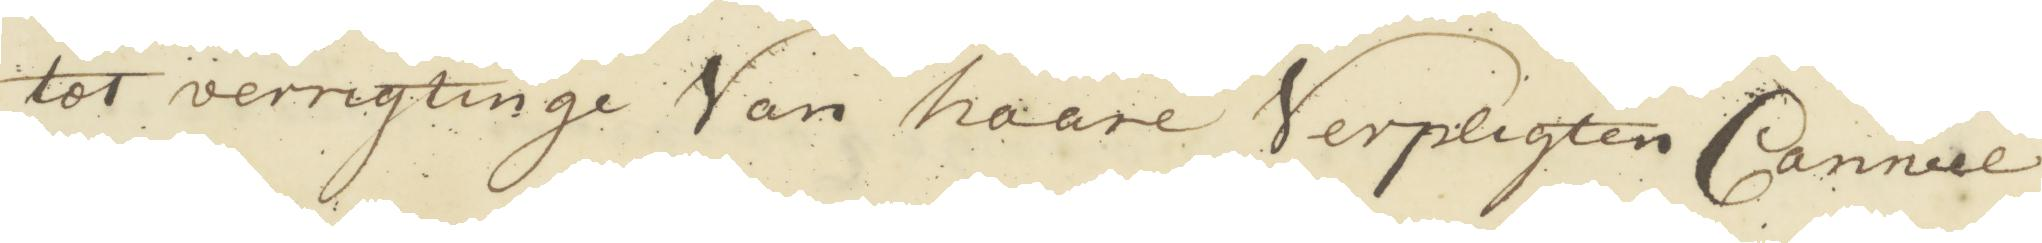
tot verrigtinge Van haare Verpligten Canneel
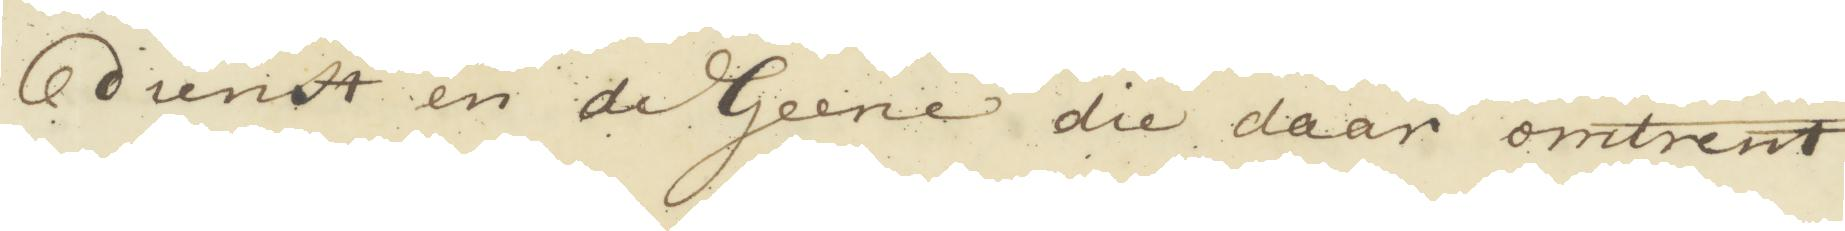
dienst en de Geene die daar omtrent
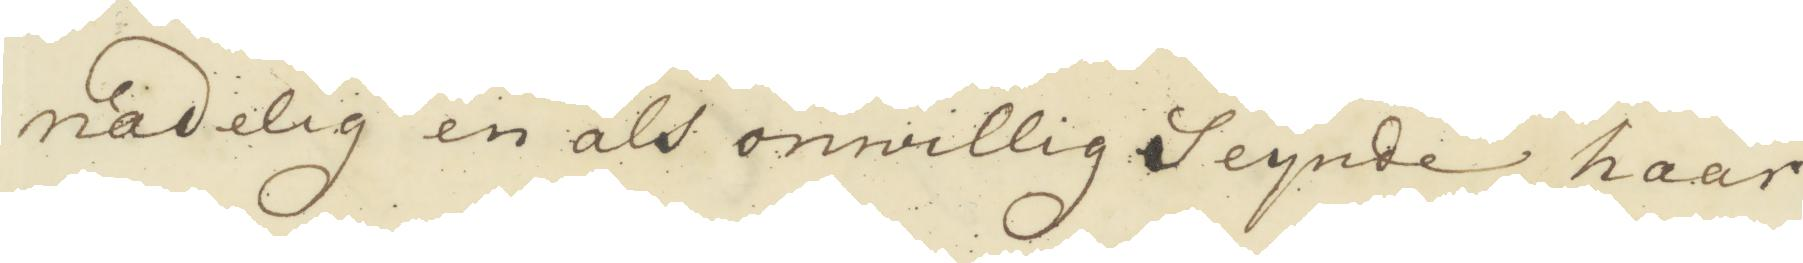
nadelig en als onwillig Seynde, haar
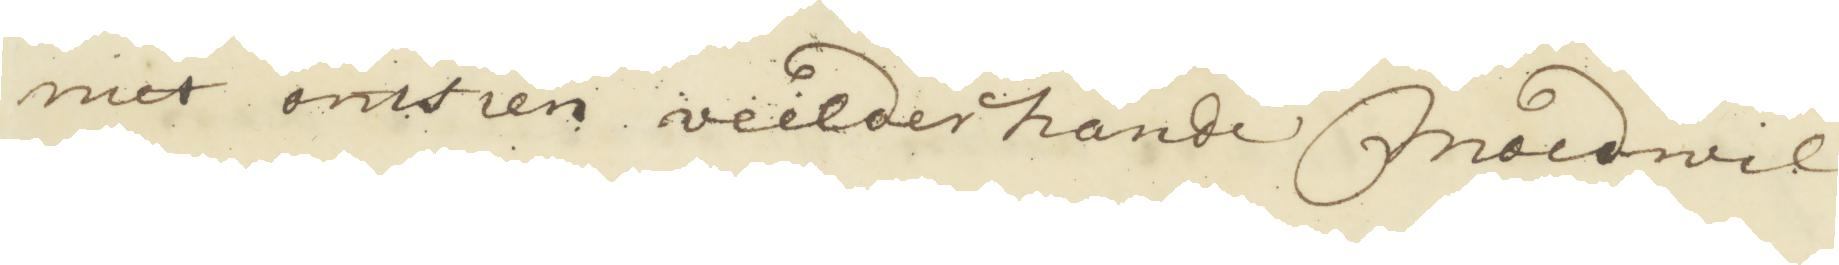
niet ontsien veelder hande moedwil
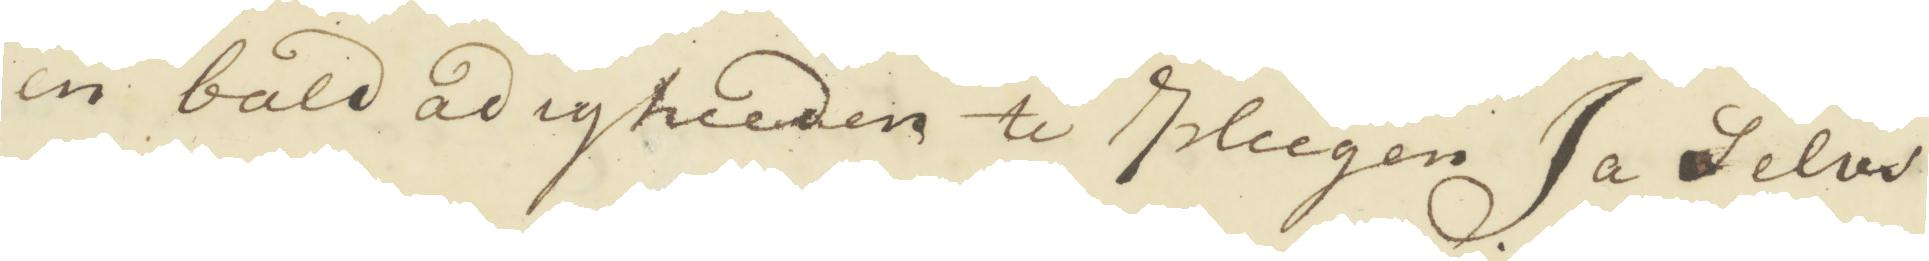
en baldadigheeden te pleegen Ja Selvs
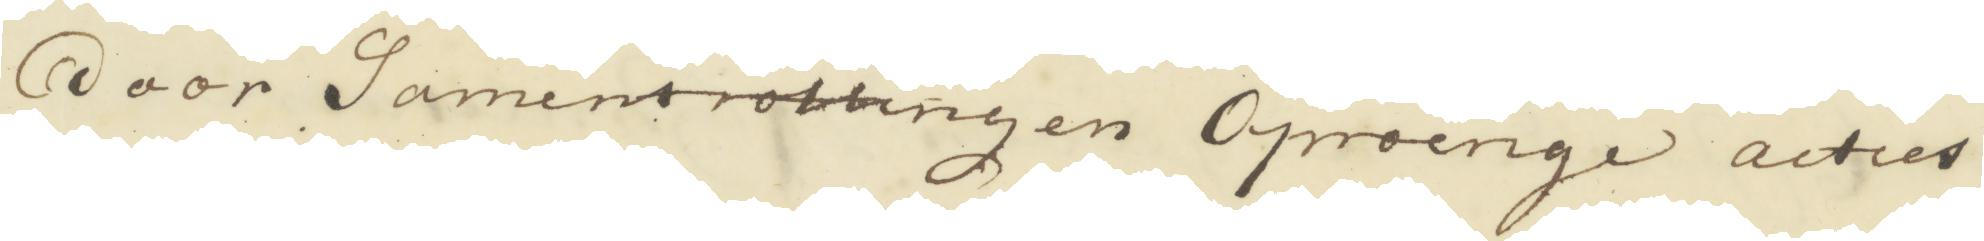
door Samentrotting en Oproerige acties
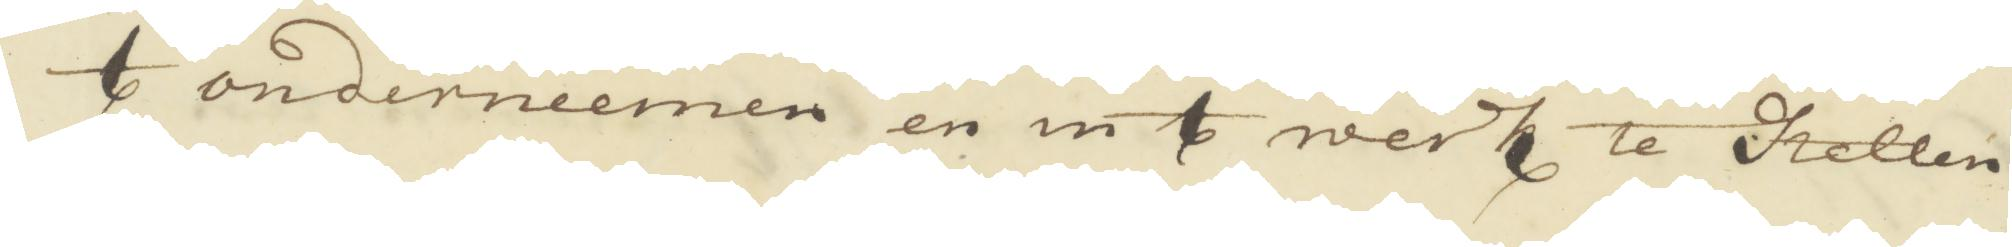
te onderneemen en in te werk te stellen
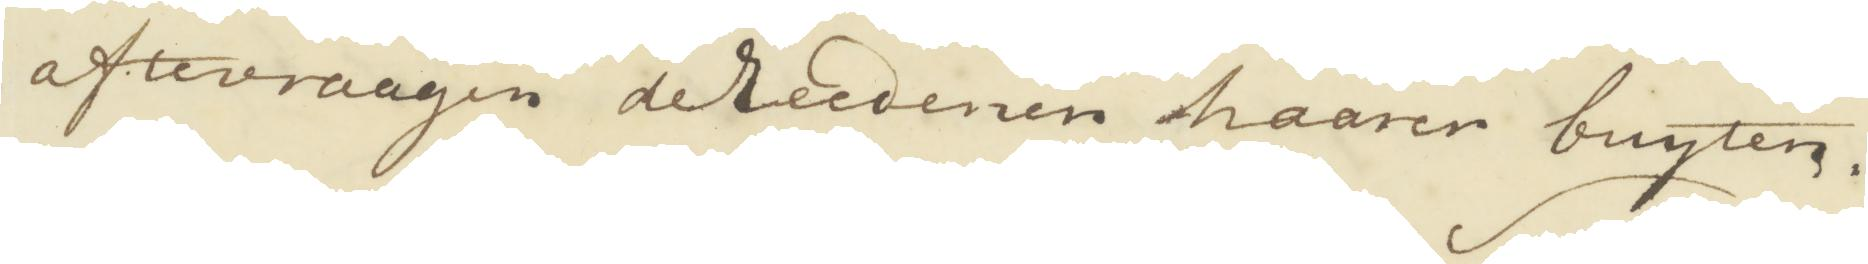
aftevraagen de reedenen haarer buyten„
